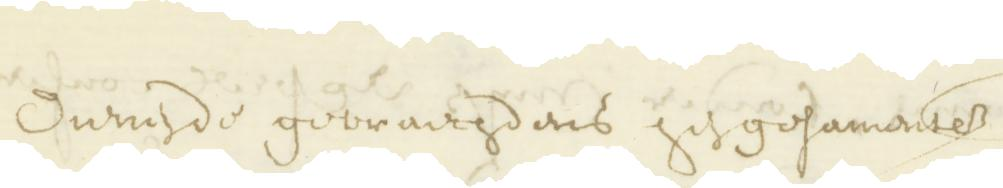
dienende gevraechdens hy gesamentelijk
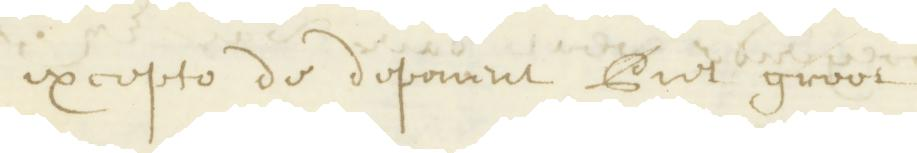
excepto de deponent Piet groot
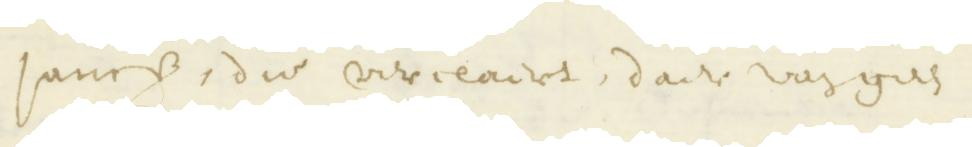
Jansz, die verclaert, daer van geen
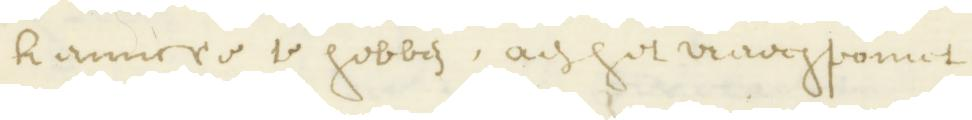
kennisse te hebben, aen het vraachpoinct
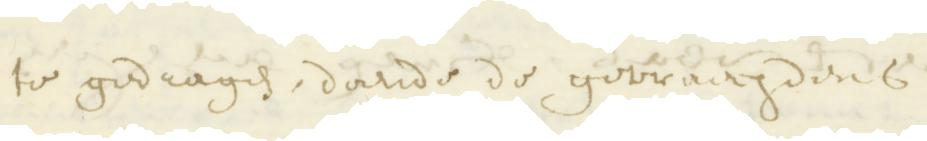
te gedragen, doende de getraech dens
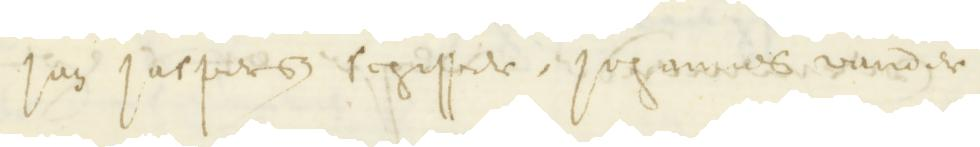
jaen jaspers schipper, johannes, vander
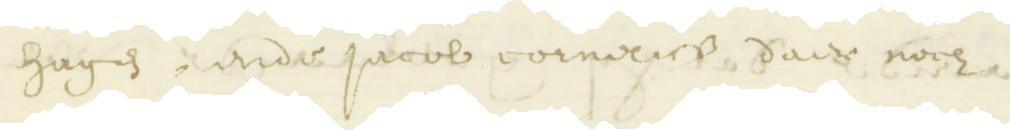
huijen; ende Jacob corneliss daer noch
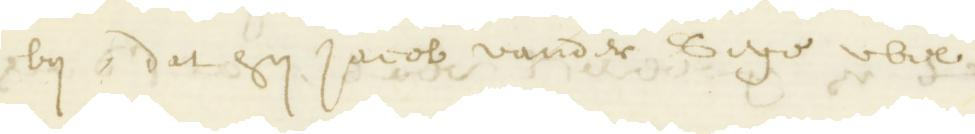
bij, dat hij Jacob vander sege wel
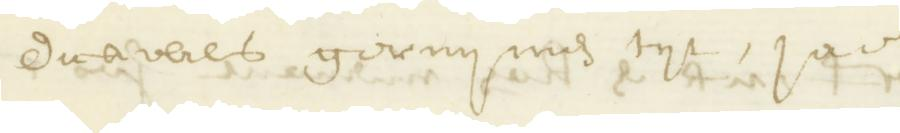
dich wes gernij men tijt, jan
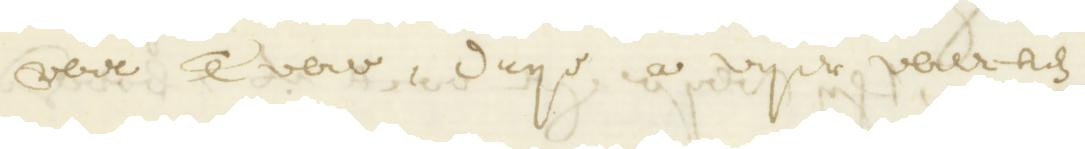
wel e wee, drije a vijer weecken
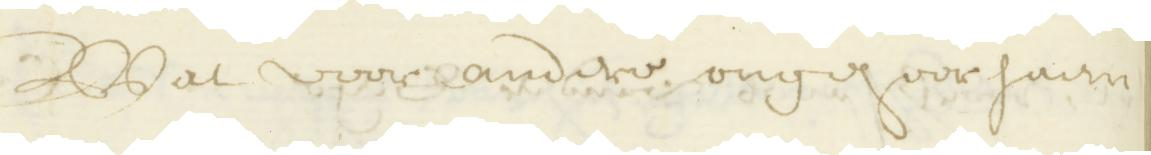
Wet voor andere ongehoor saen
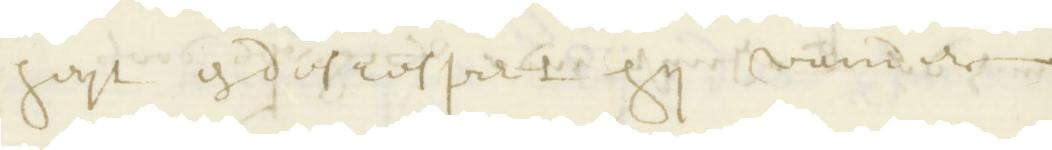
heijt en defrespect hij van der
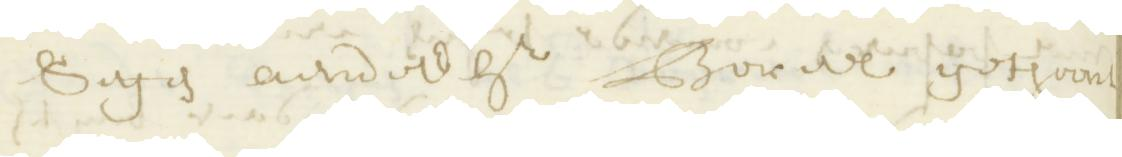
Seijen aende E Hr Bereel ijethoon
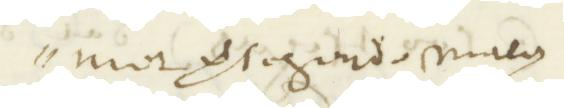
„ met verschend malen
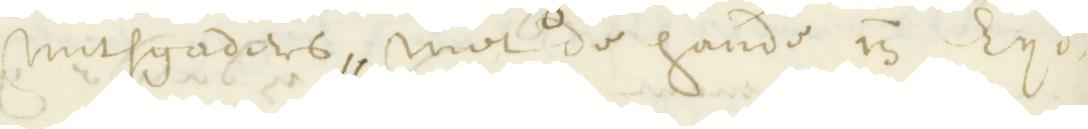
mitsgaders „ met de hande in hijd
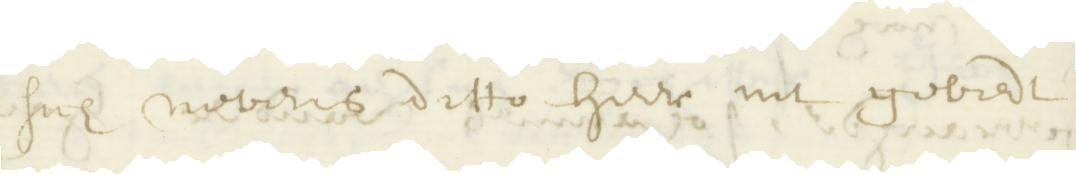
sich netrens ditto Heer int gebredt
